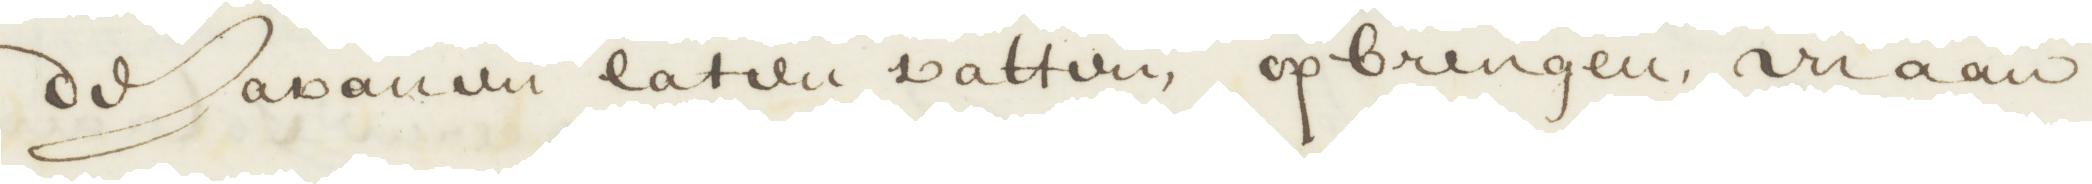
de Javanen laten vatten, opbrengen, en aan
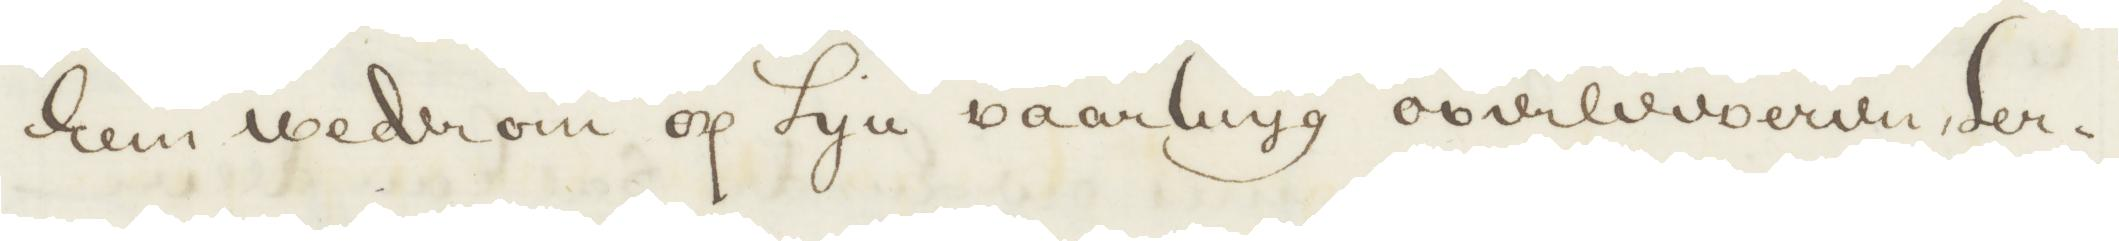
hem weder om op sijn vaartuijg overleeveren, ter„
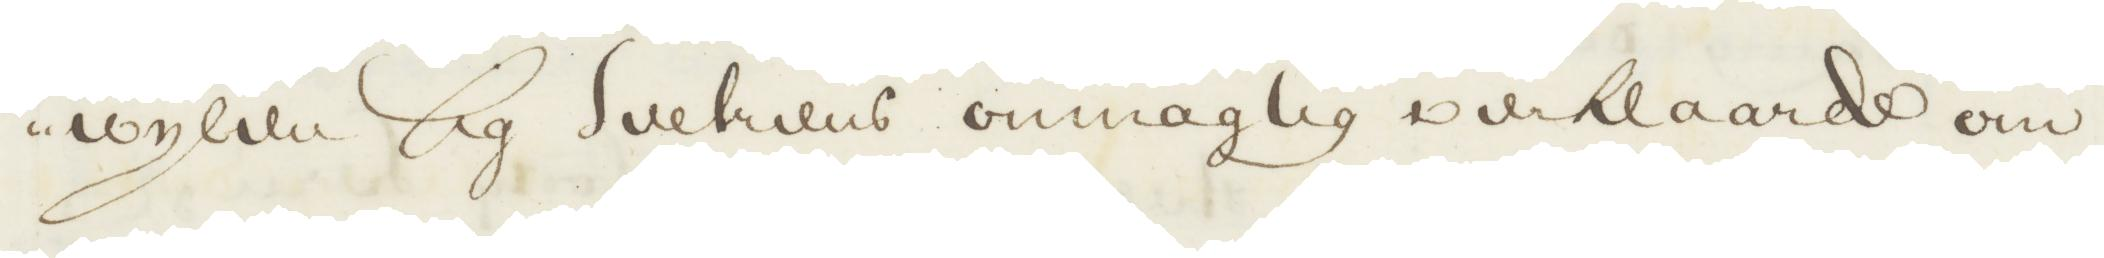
„wylen sig telkens onmagtig verklaarde om
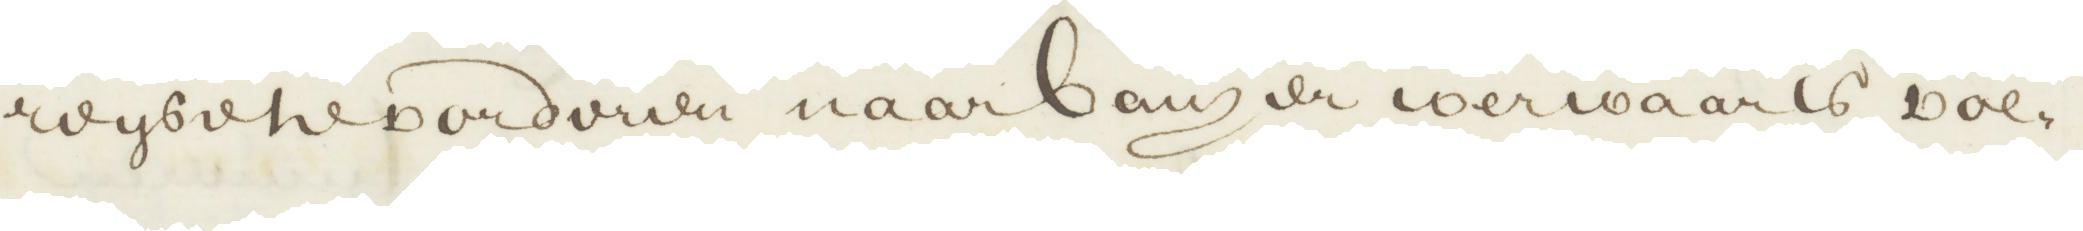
reijse tevorderen naar banjer werwaarts vol„
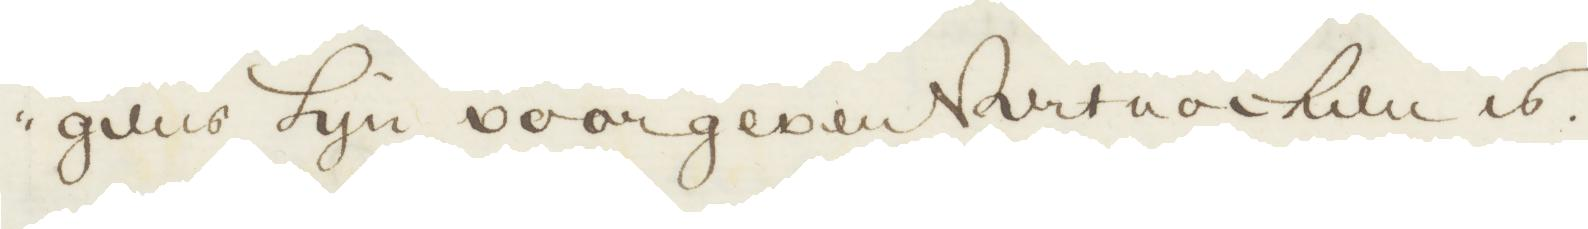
„gens sijn voorgeven vertrocken is.
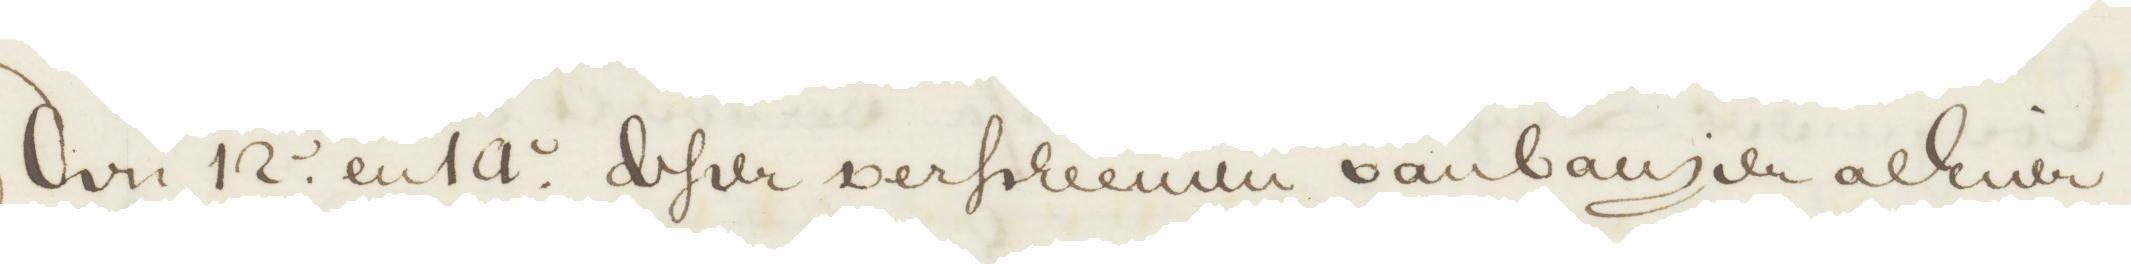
den 12.e en 14.e deser verscheenen van banjer alhier
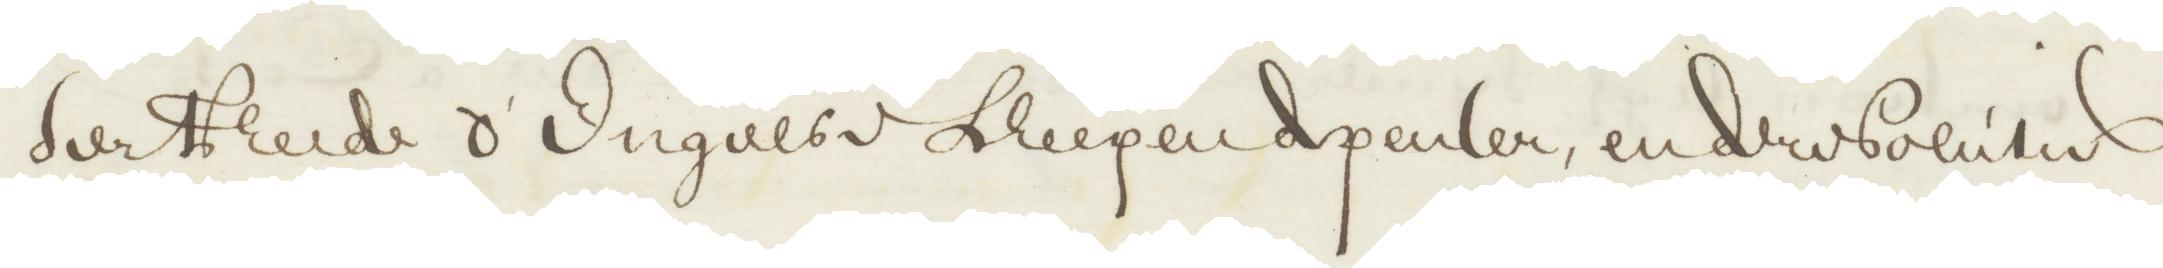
ter Rheede d’ Engelse scheepen depenter, en de resolutie
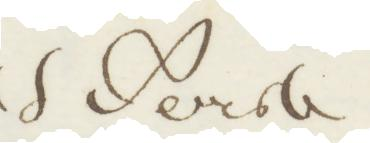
't Eerst
